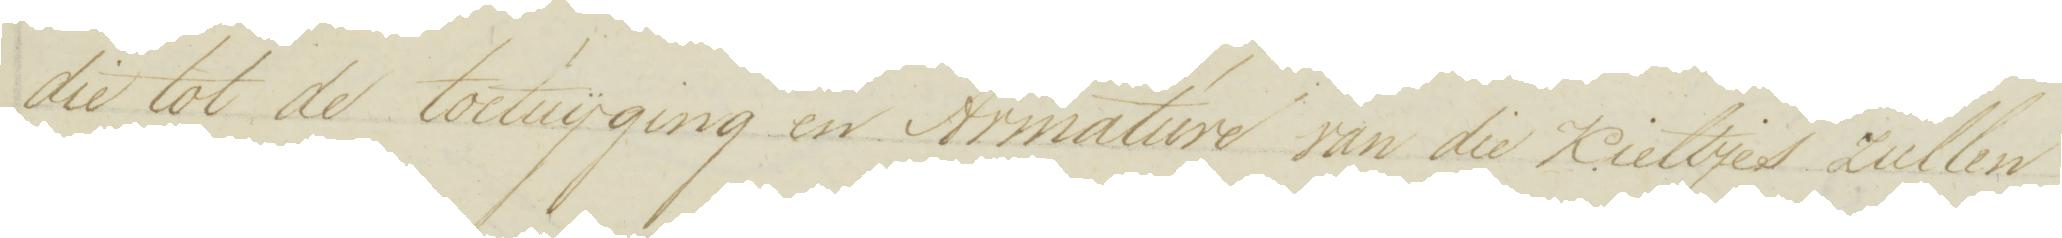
die tot de toetuijging en Armature van die kieltjes zullen
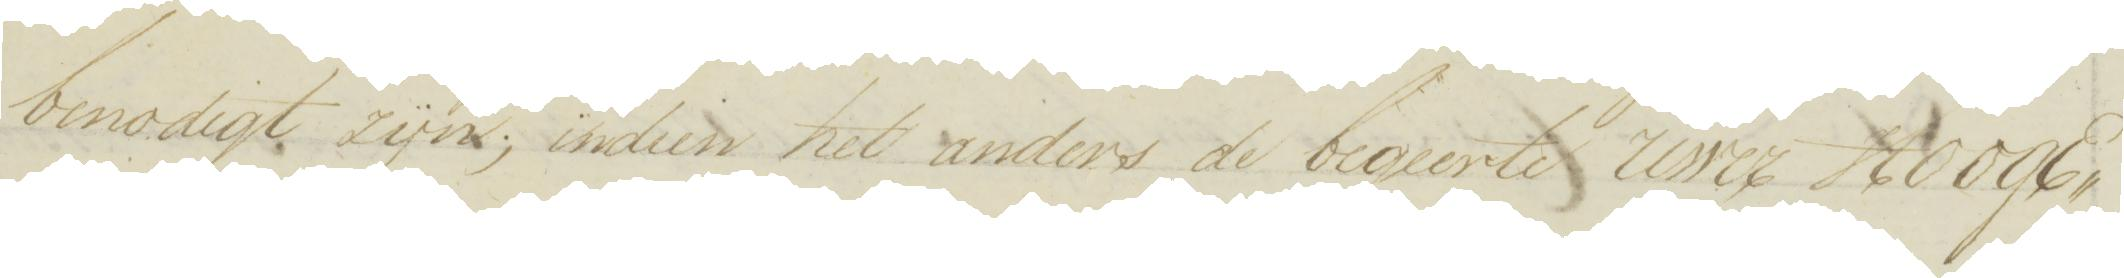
benodigt zijn; indien het anders de begeerte uwer Hoog E„
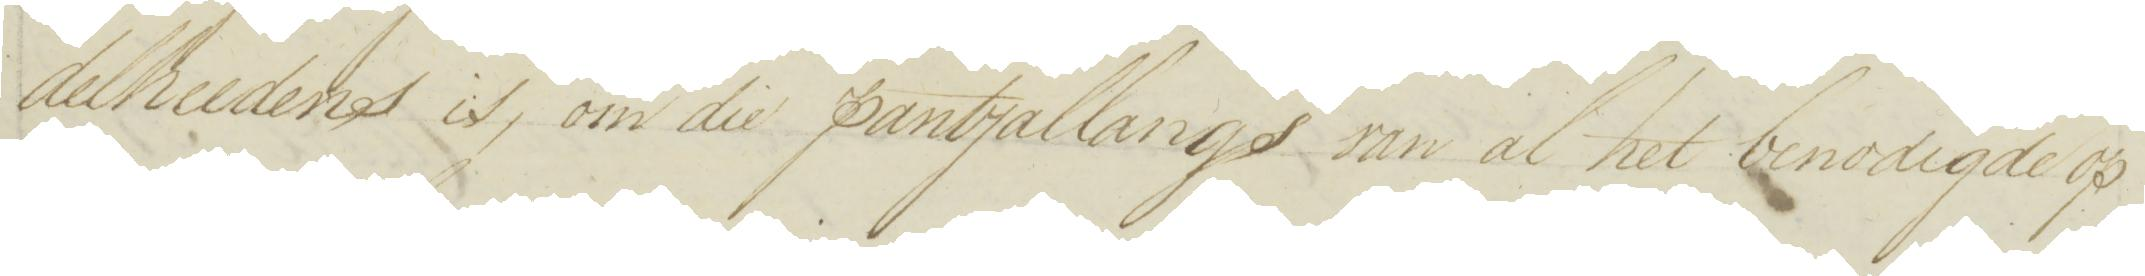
delheedens is, om die pantjallangs van al het benodigde op
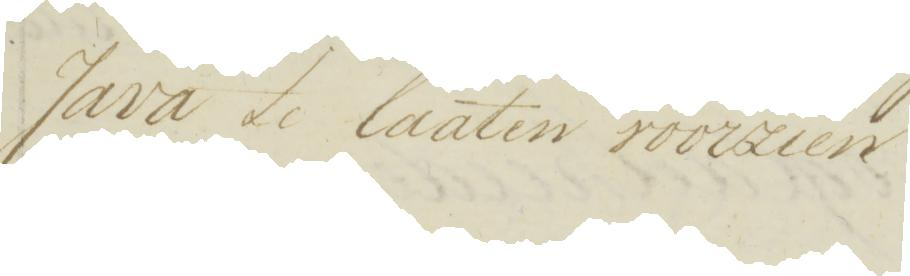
Java te laaten voorzien
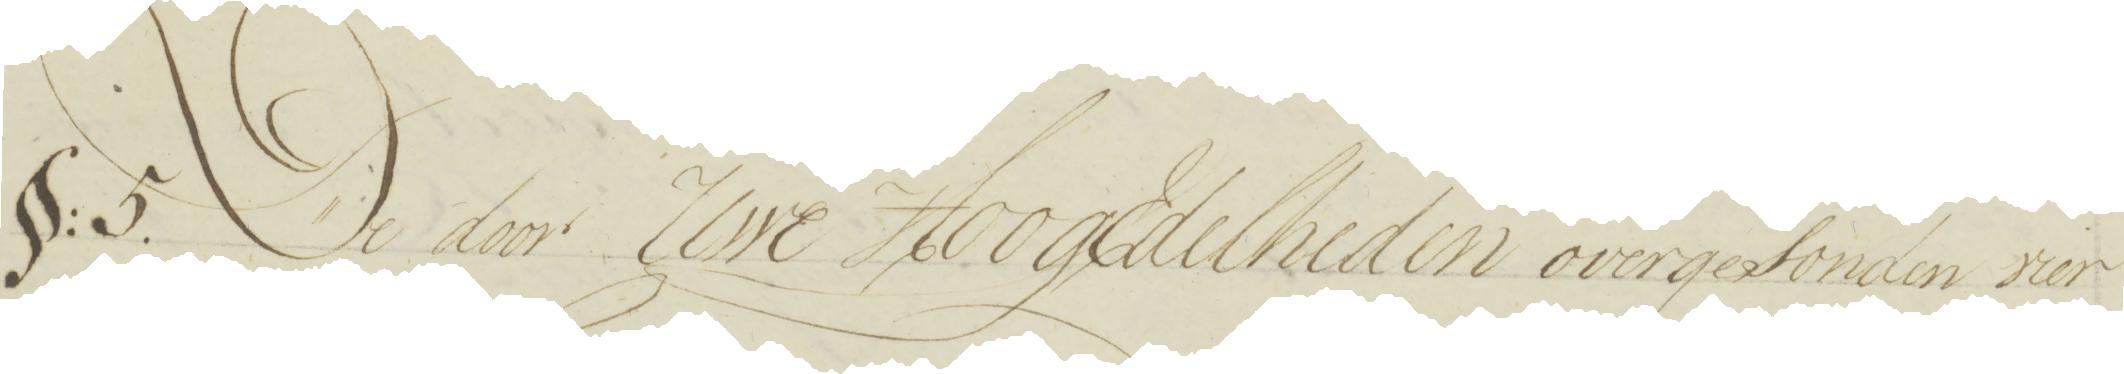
§: 5. De door Uwe Hoog Edelheden overgesonden vier
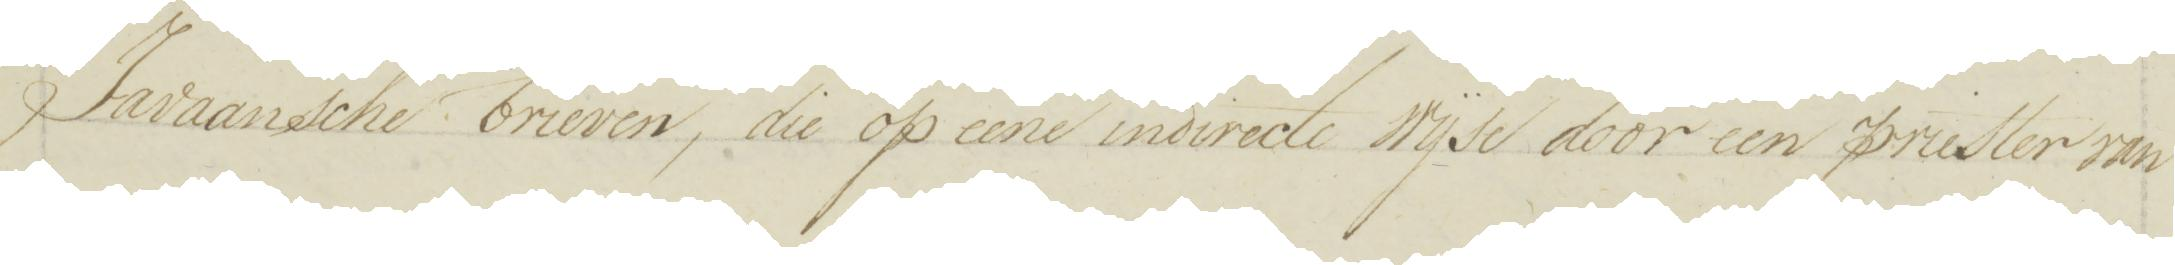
Iavaansche brieven, die op eene indirecte wijse door een priester van
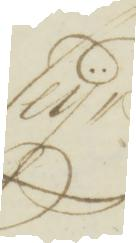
eij„
